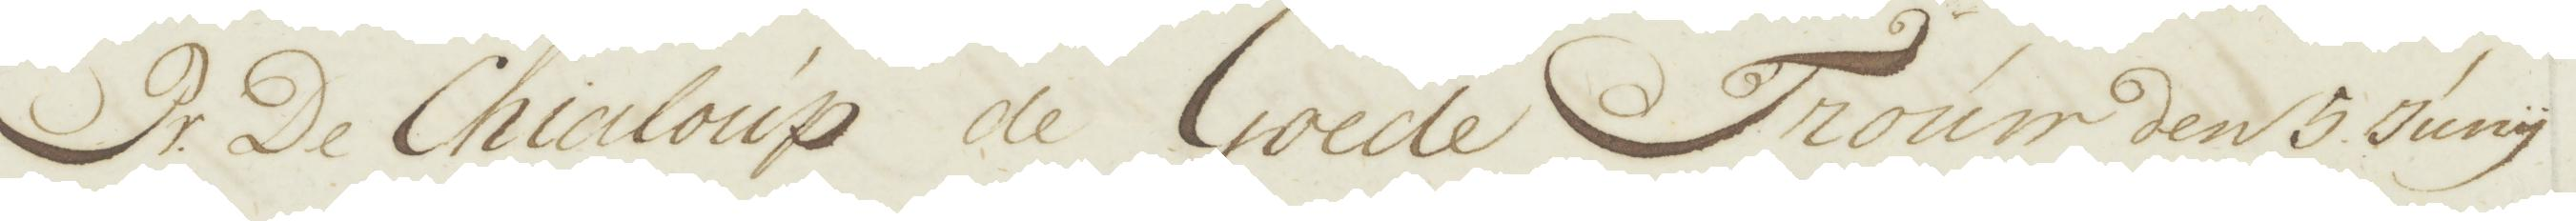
Pr. De Chialoup de Goede Trouw den 5 Junij
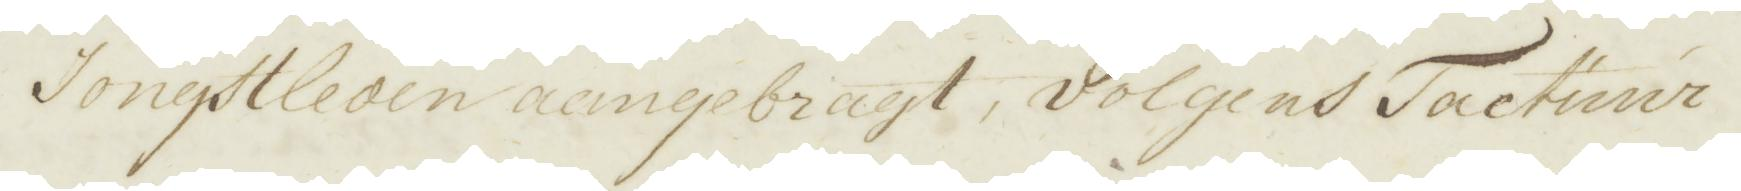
Jongstleden aangebragt, volgens Tactuur
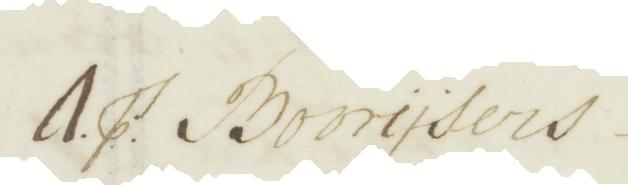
4. p.s Boorijsers
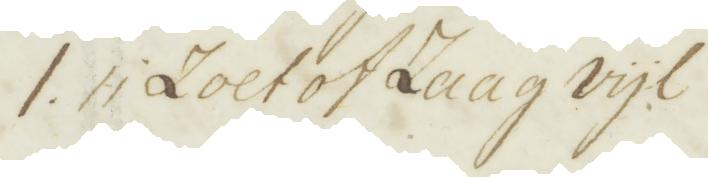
1. „ Zoet of zaag vijl
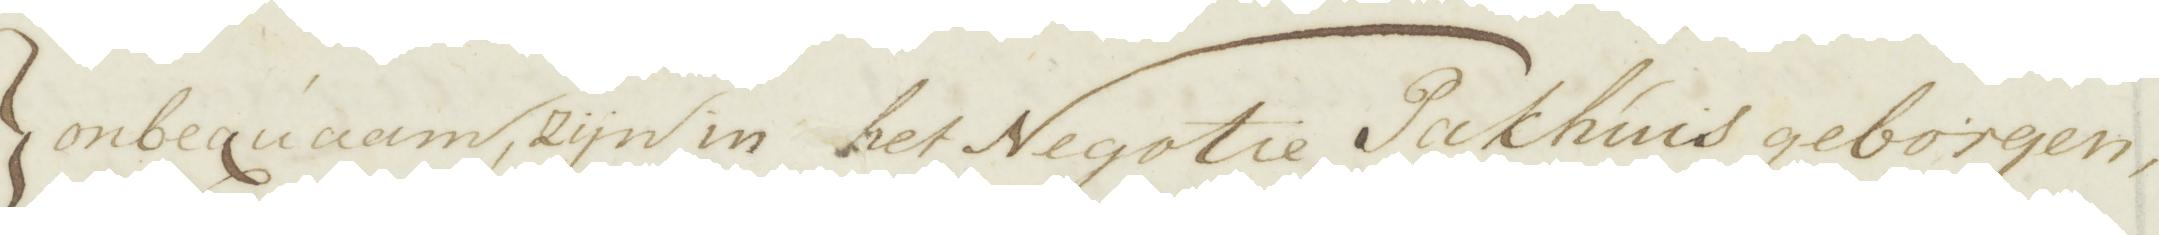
onbequaam, zijn in het Negotie Pakhuis geborgen
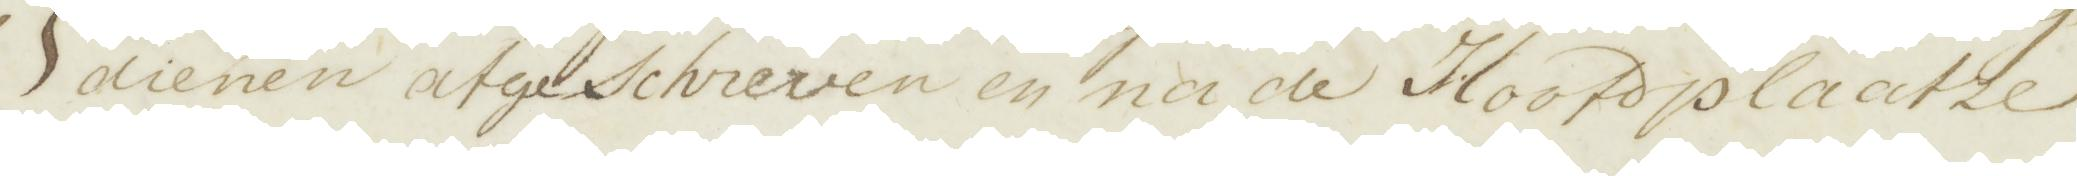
dienen afgeschreven en na de Hoofdplaatze
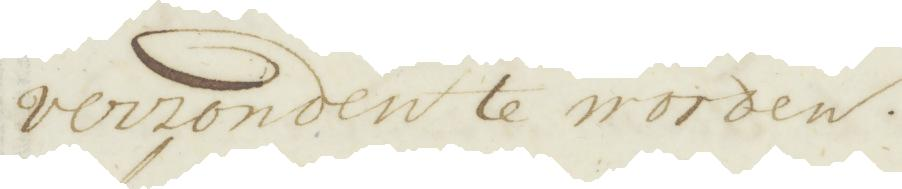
verzonden te worden
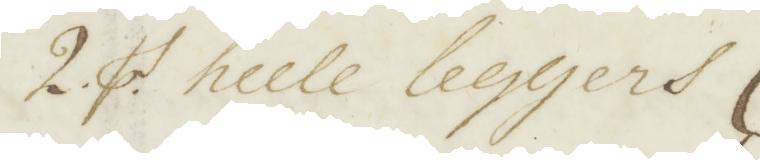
2. p.s heele leggers
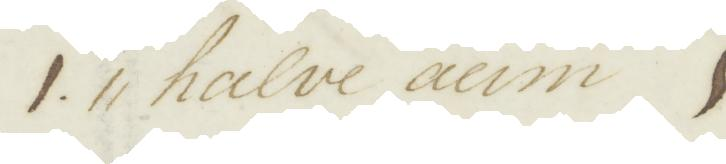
1. „ halve aam
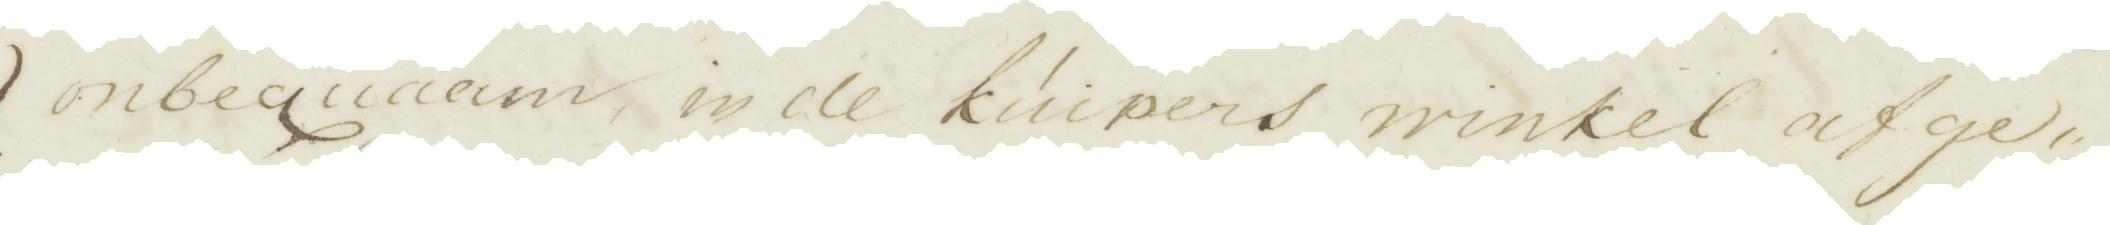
onbequaam, in de kuipers winkel afge„
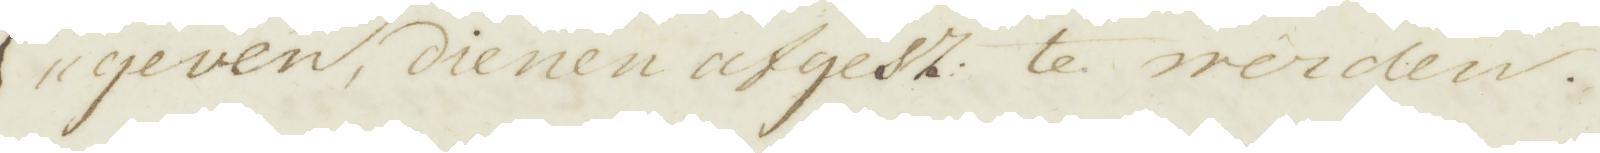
„geven, dienen afgesz: te werden.
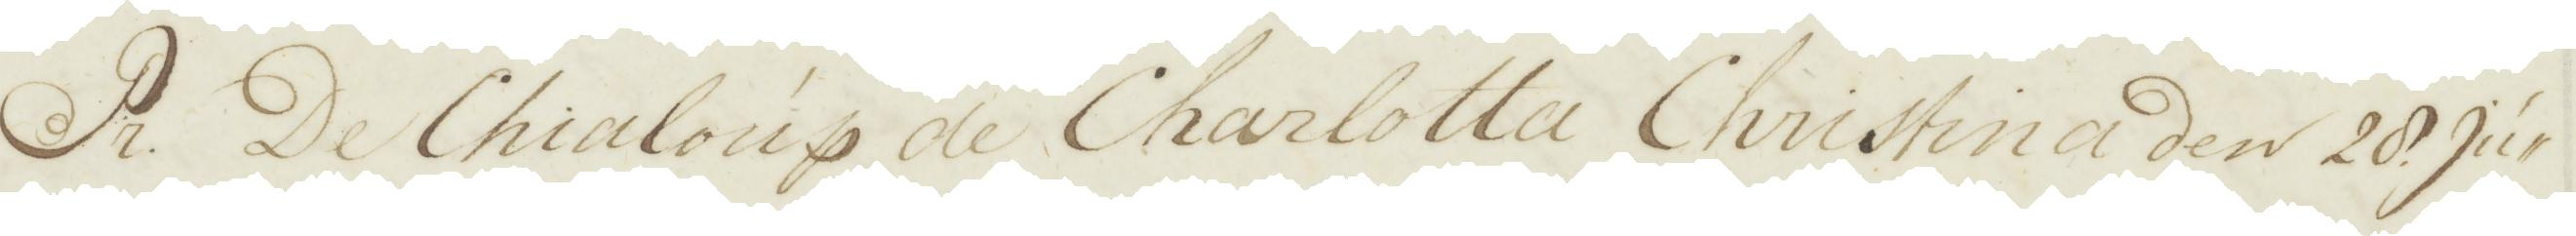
Pr. De Chialoup de Charlotta Christina den 28. Ju„
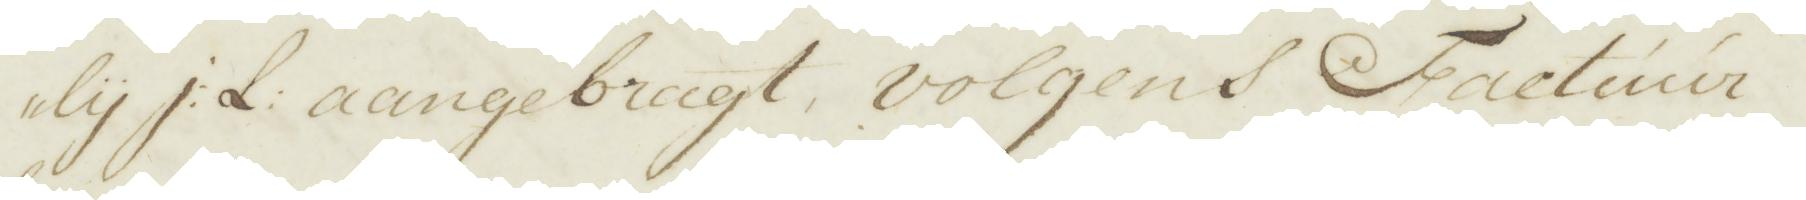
lij j: l: aangebragt, volgens Factuur
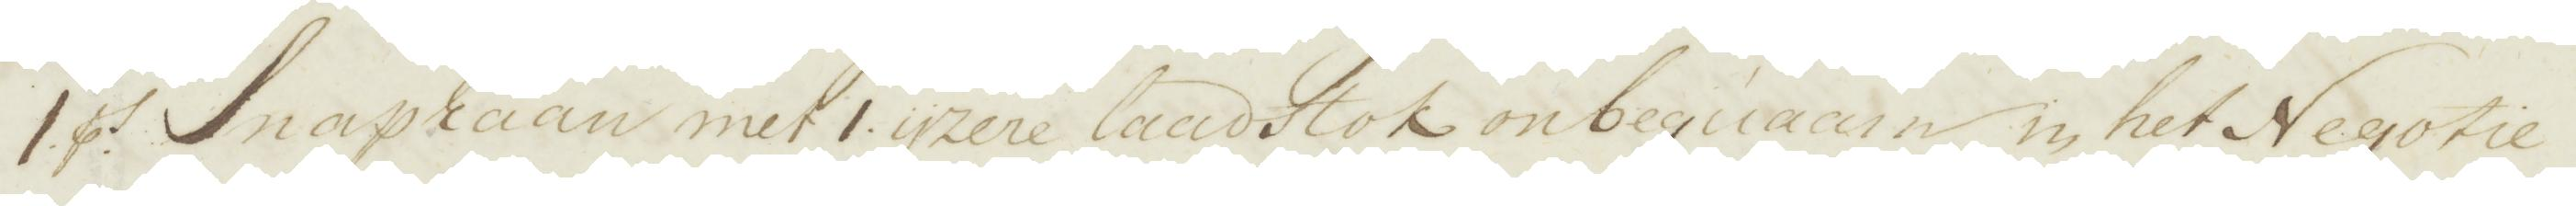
1. p.s Snaphaan met 1. ijzere laadstok onbequaam in het Negotie
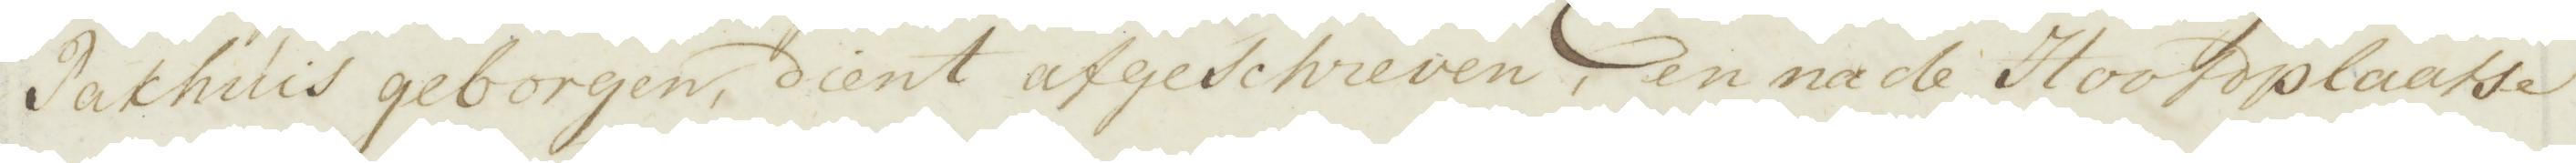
Pakhuis geborgen, dient afgeschreven, en na de Hoofdplaatse
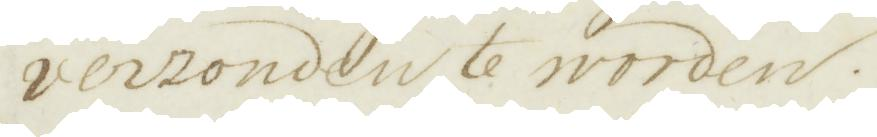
verzonden te worden.
